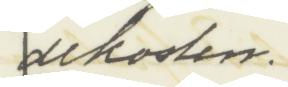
dekosten.
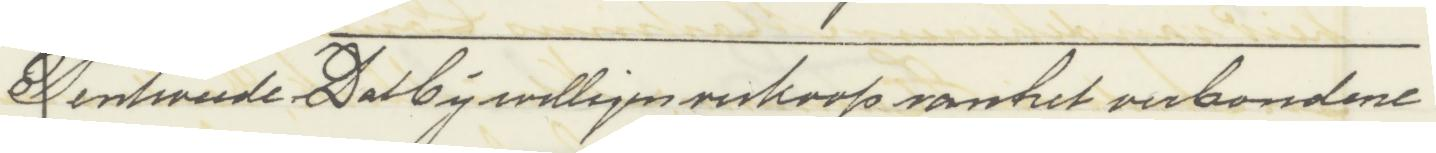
Tentweede. Dat bij willigen verkoop van het verbondene
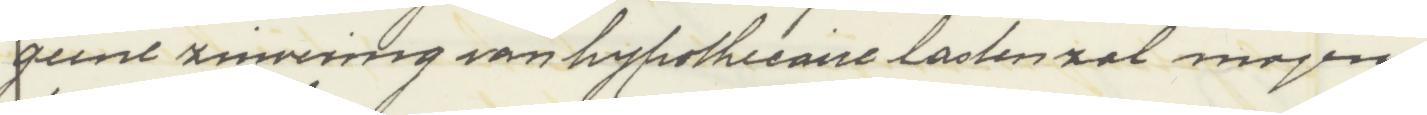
geene zuivering van hypothecaire lasten zal mogen
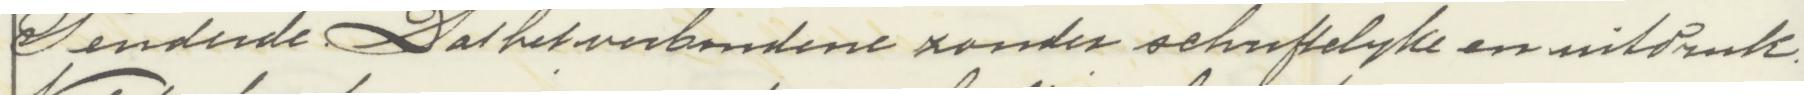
Tenderde. Dat het verbondene zonder schriftelyke en uitdruk.
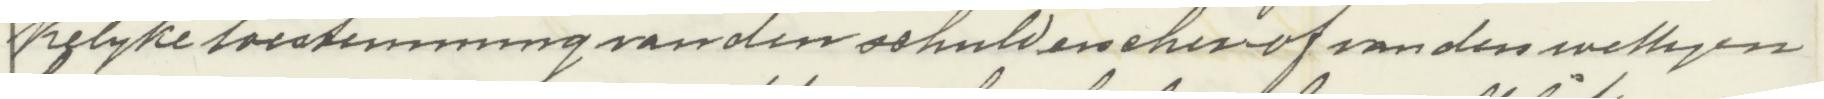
kelyke toestemming van den schuldeischer of van den wettigen
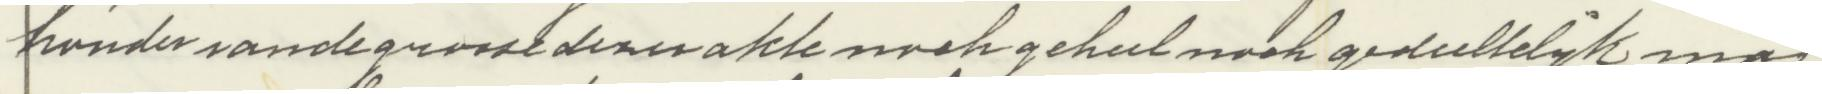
houder van de grosse dezer akte noch geheel noch gedeeltelyk mag
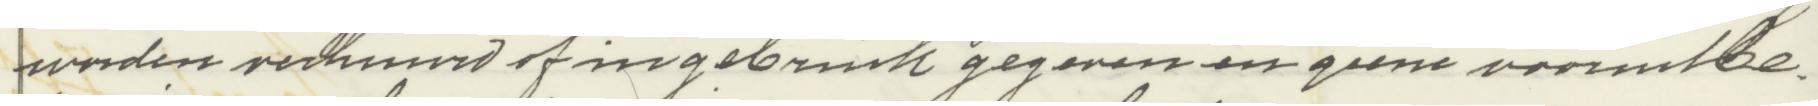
worden verhuurd of in gebruik gegeven en geene vooruitbe„
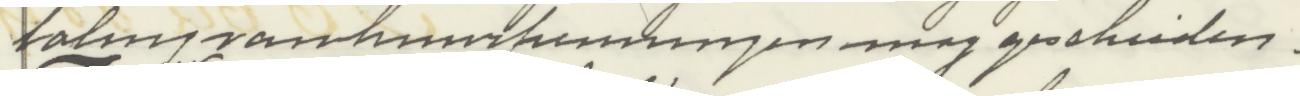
taling van huurpenningen mag geschieden.
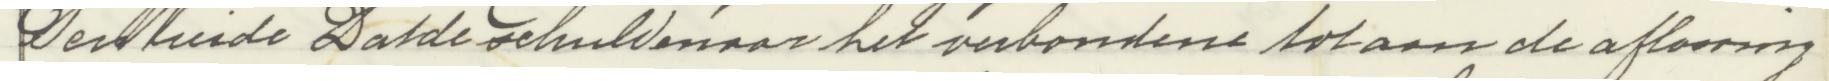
Ten Vierde Dat de schuldenaar het verbondene tot aan de aflossing
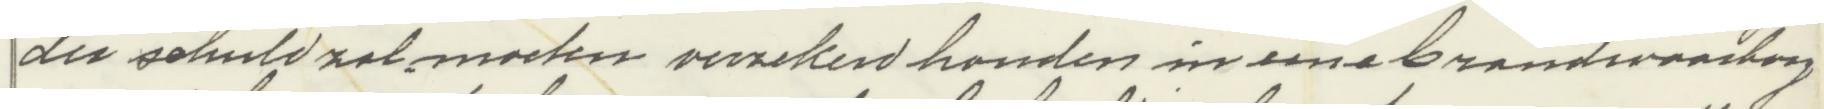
der schuld zal moeten verzekerd houden in eene brandwaarborg
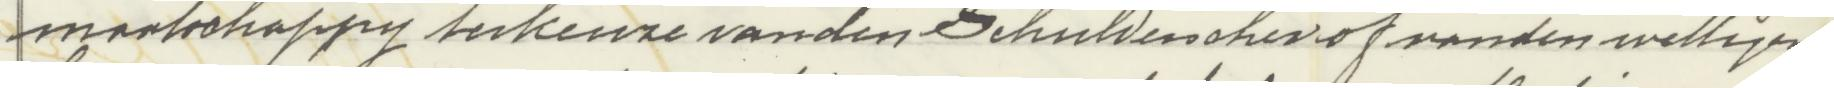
maatschappy terkeuze van den Schuldeischer of van den wettigen
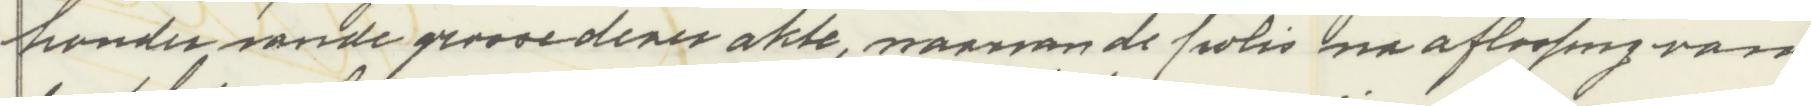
houder van de grosses dezer akte, waarvan de polis na aflossing van
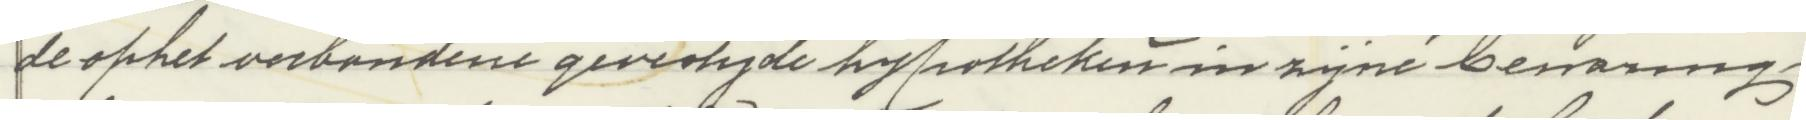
de op het verbondene gevestigde hypotheken in zijne bewaring
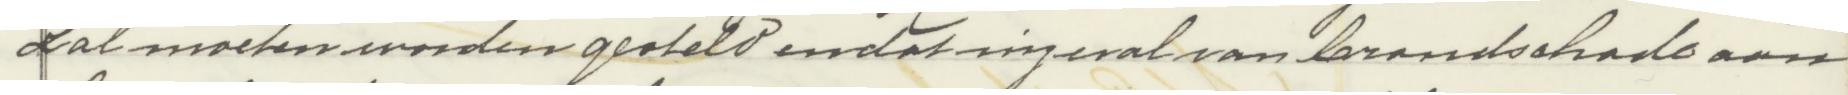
zal moeten worden gesteld en dat ingeval van brandschade aan
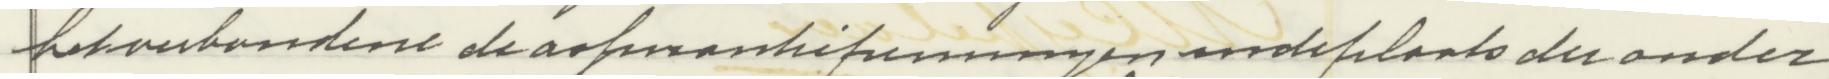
het verbondene de assurantiepenningen indeplaats der onder
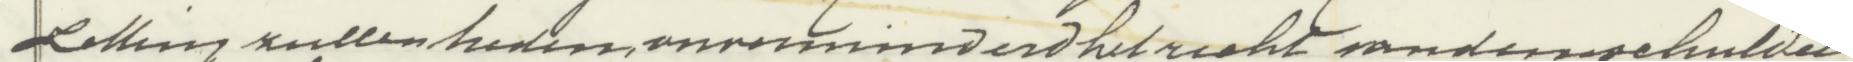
zetting zullen treden, onverminderd het recht van den schuldei
